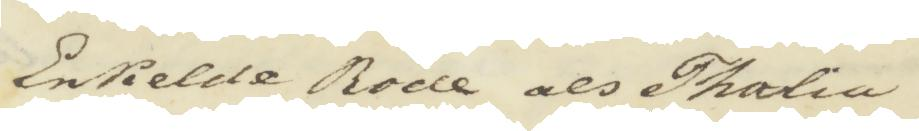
Enkelde Rode als Thalia
